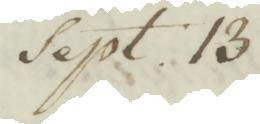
Sept. 13
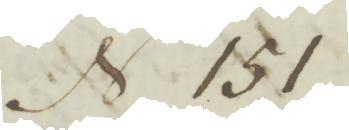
N: 151.
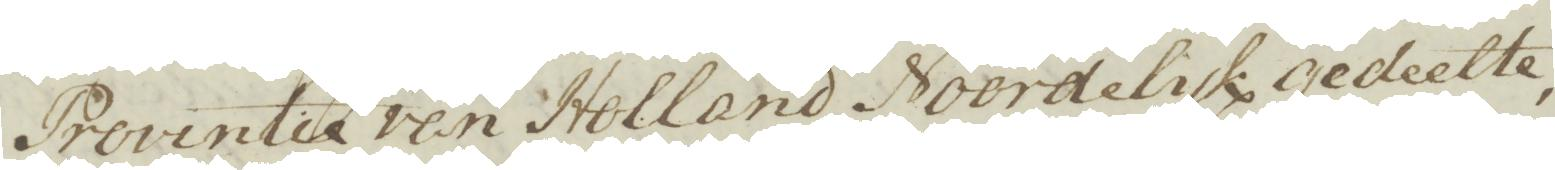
Provintie van Holland, Noordelyk gedeelte,
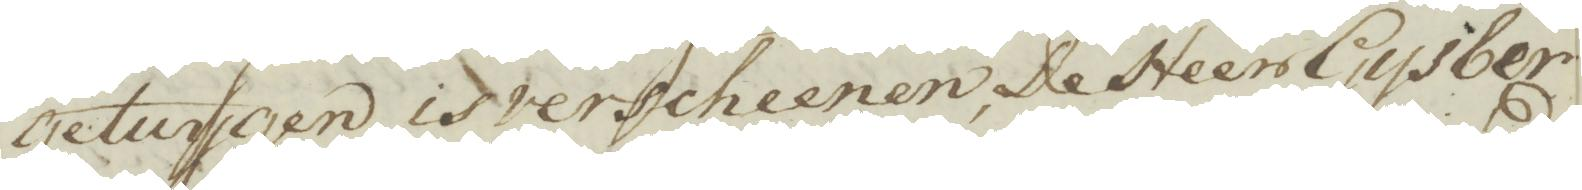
getuygen, is verscheenen, De Heer Gijsber„
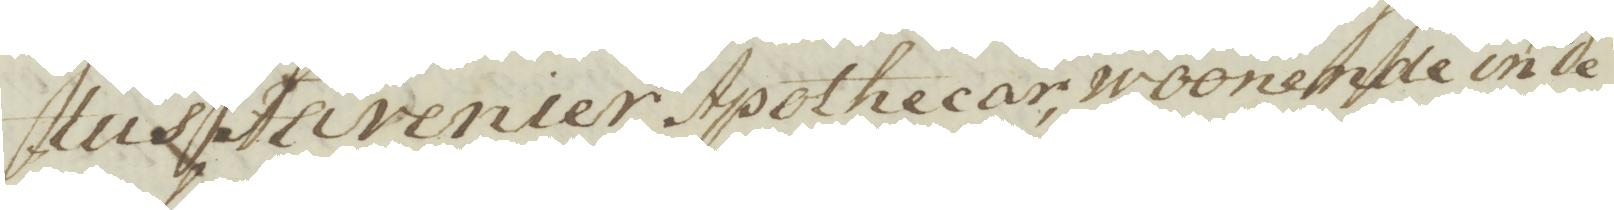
us Tavenier, Apothecar, woonende in de
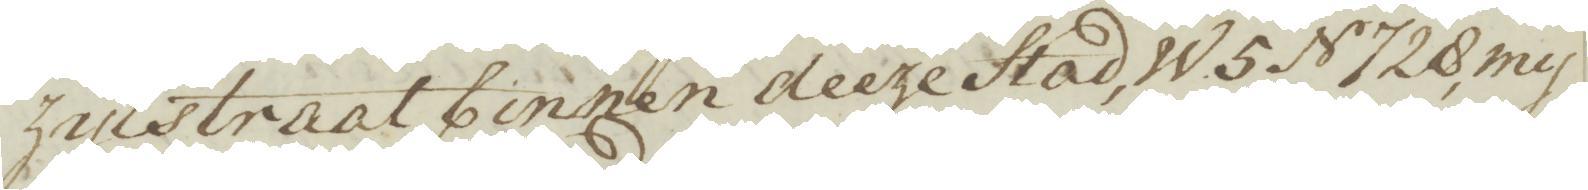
zylstraat binnen deeze Stad, W.5 N728, my
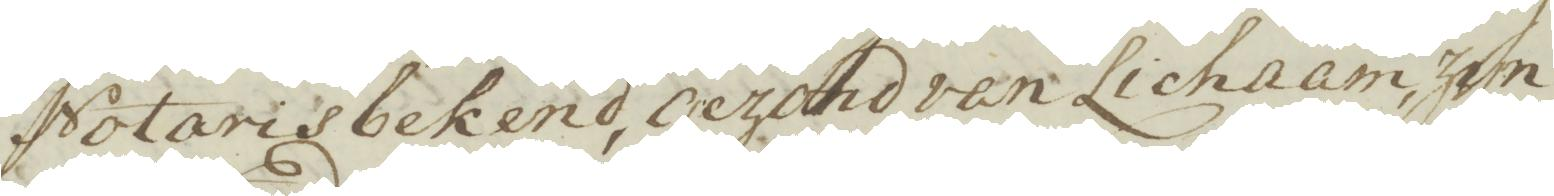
Notaris bekend, gezond van Lichaam, zyn
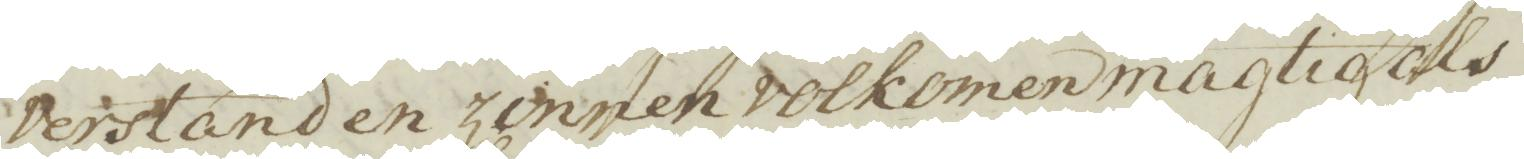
verstand en zinnen volkomen magtig als
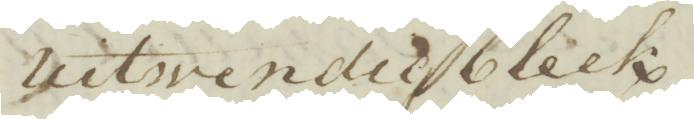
uitwendig bleek
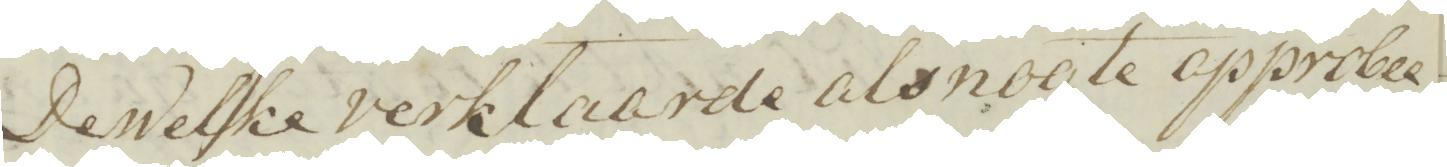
Dewelke verklaarde als nog te approbee
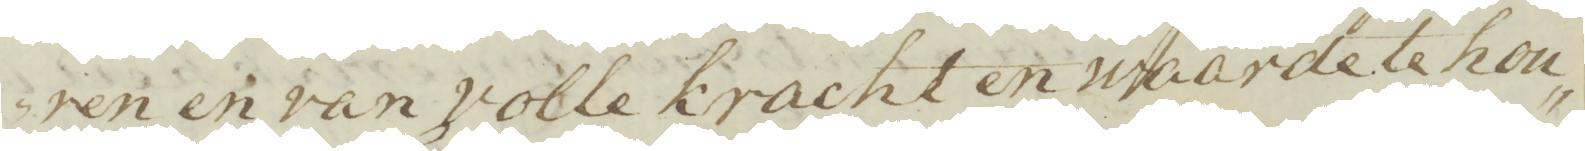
„ren en van volle kracht en waarde te hou„
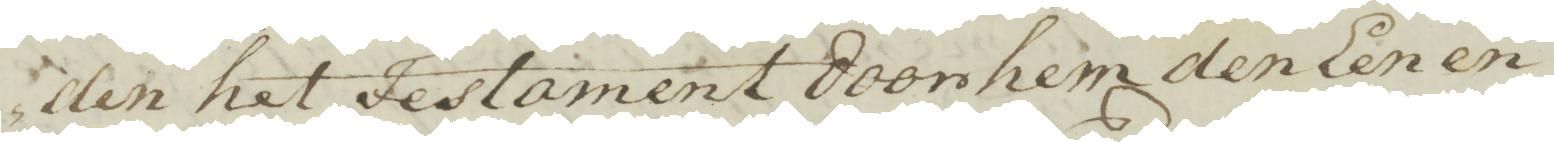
„den het Testament door hem den Een en
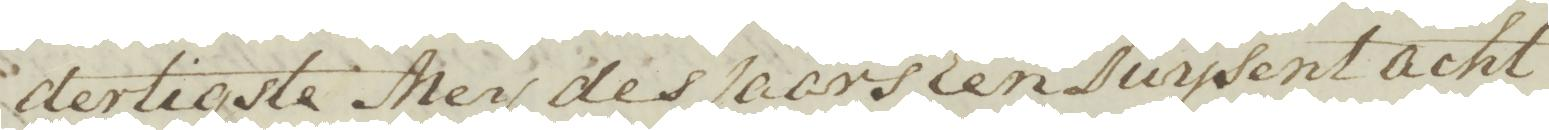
dertigste Mey des Jaars Een Duisent acht
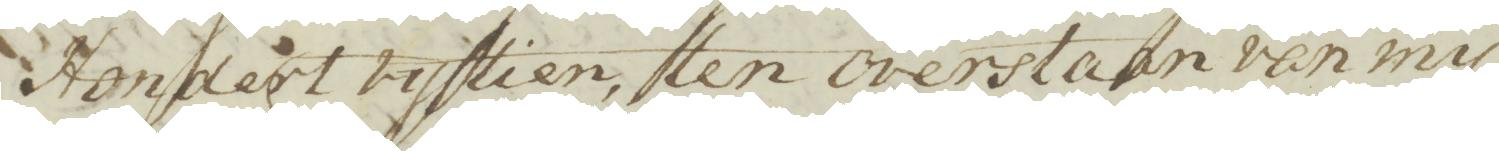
Hondert vyftien, ten overstaan van my
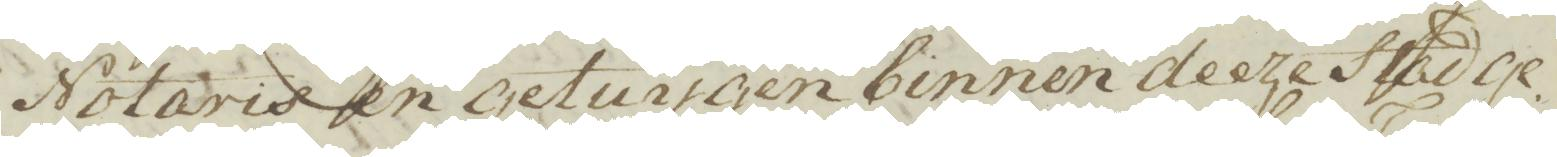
Notaris en getuygen binnen deeze Stad ge,
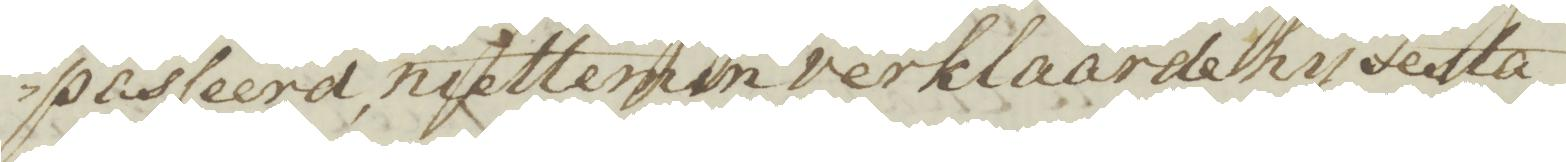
„passeerd, niettemin verklaarde hy Testa
